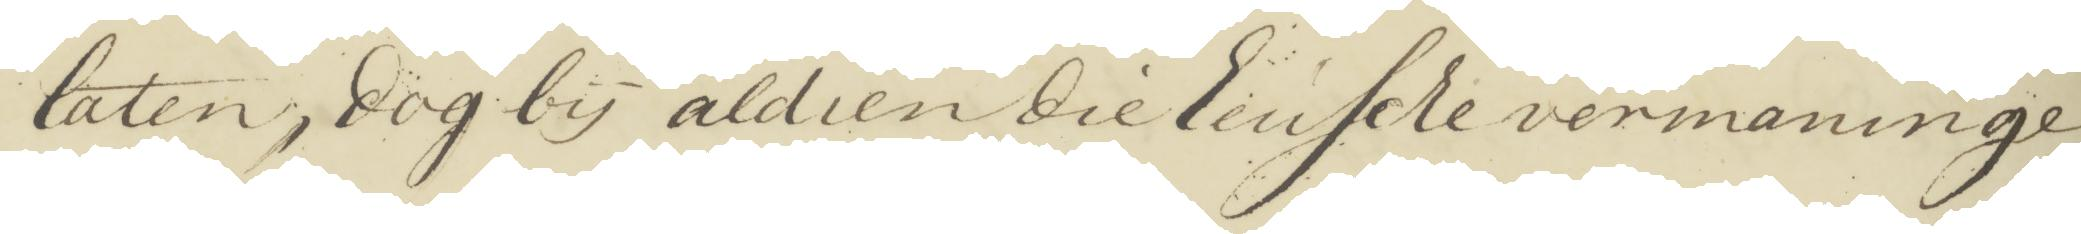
laten, dog bij aldien die heusche vermaninge
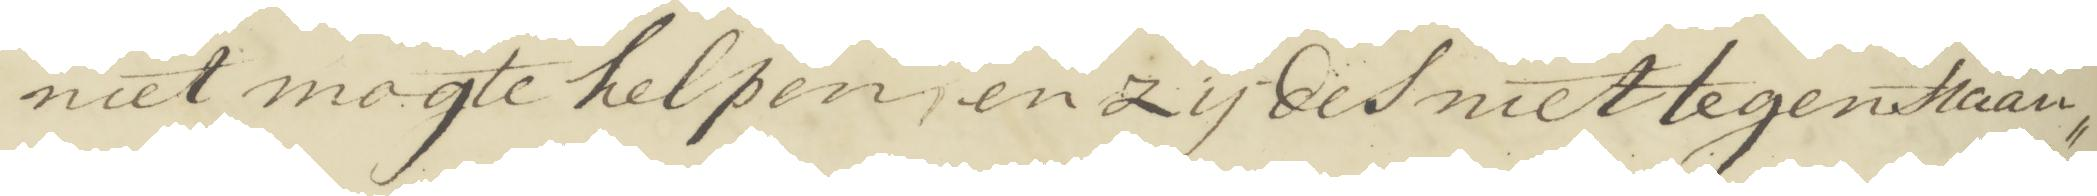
niet mogte helpen, en zij des niet tegen staan„
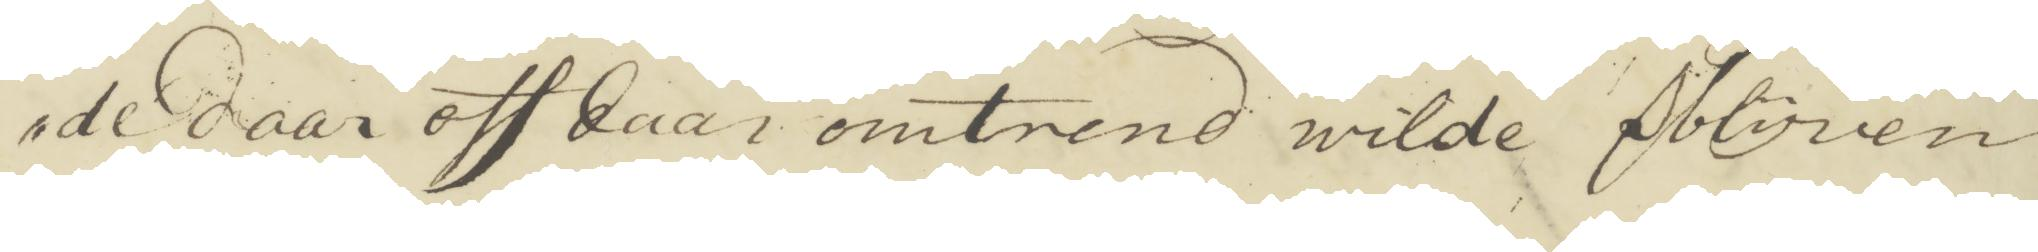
„de daar off daar omtrend wilde verblijven
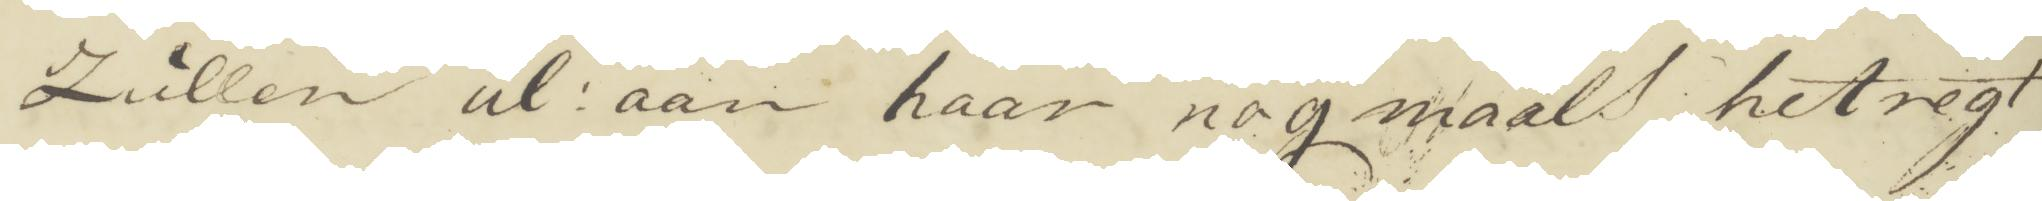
zullen ul: aan haar nog maals het regt
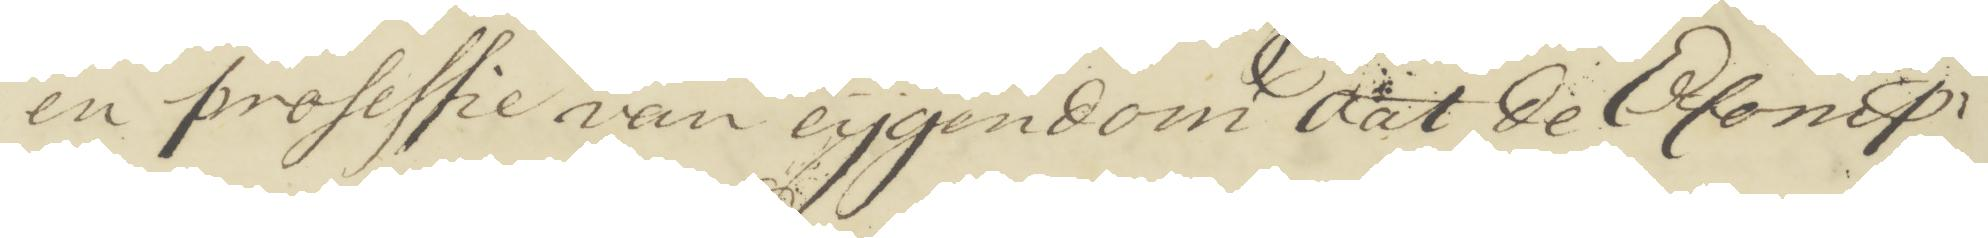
en prosessie van eijgendom dat de EComp:
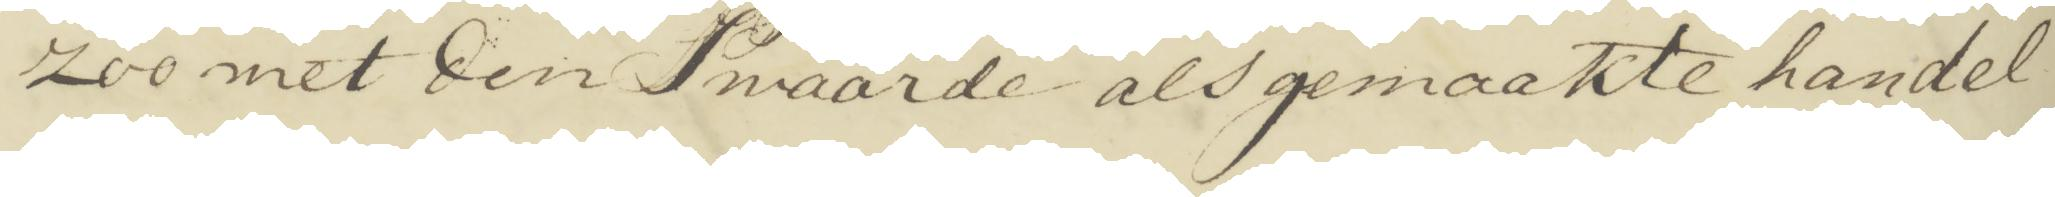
zoo met den Swaarde als gemaakte handel
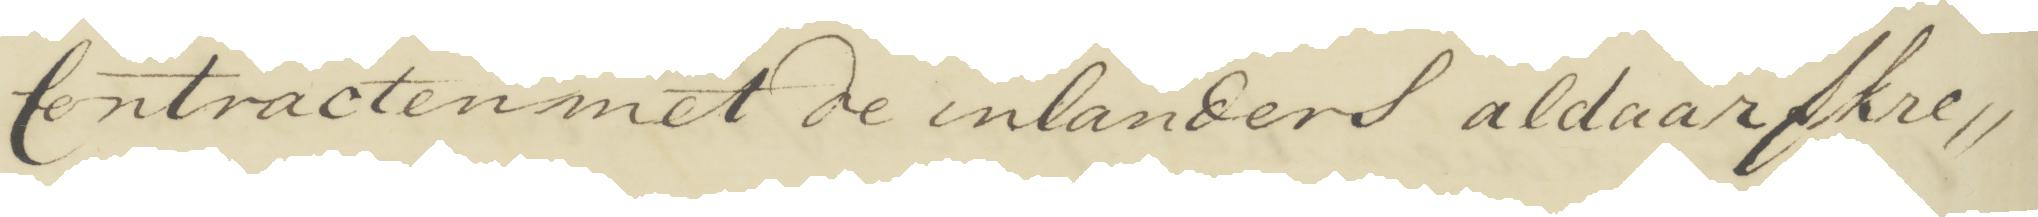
Contracten met de inlanders aldaar verkre„
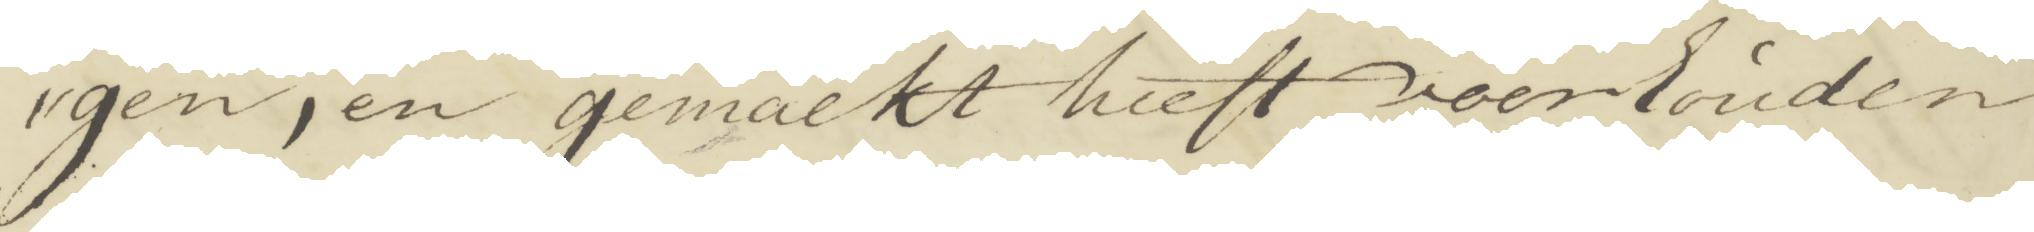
gen, en gemaekt heeft voorhouden
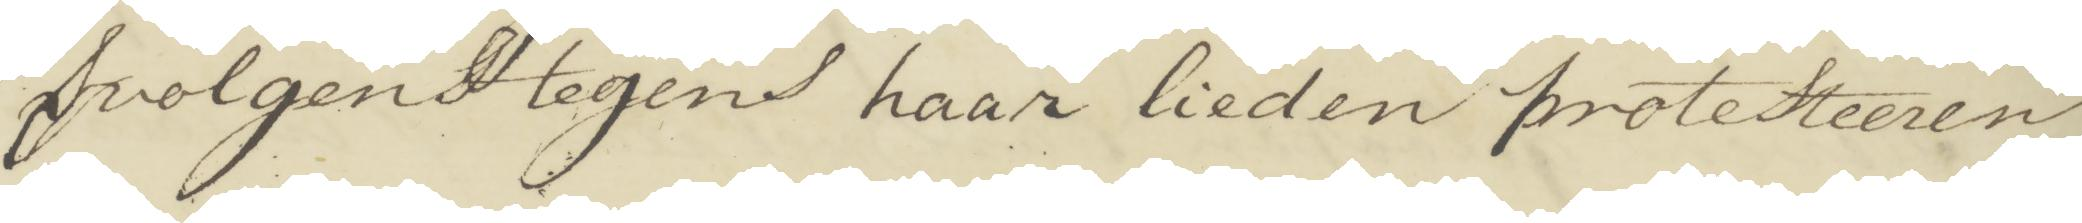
vervolgens tegens haar lieden protesteeren
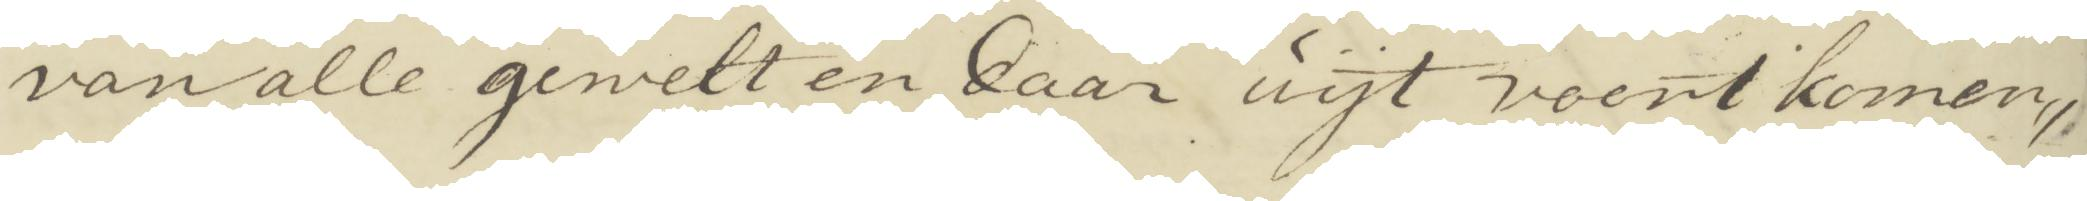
van alle gewelt en daar uijt voort komen„
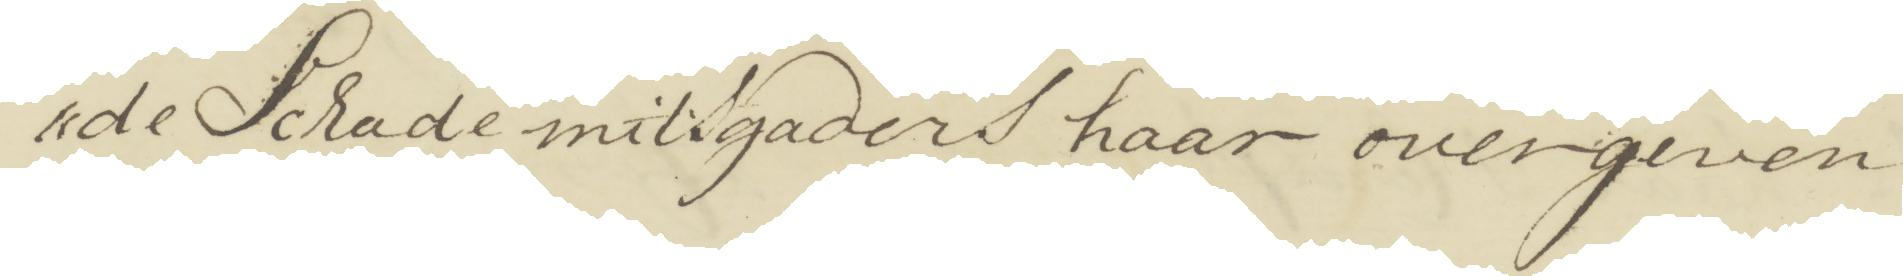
„de Schade mitsgaders haar overgeven
